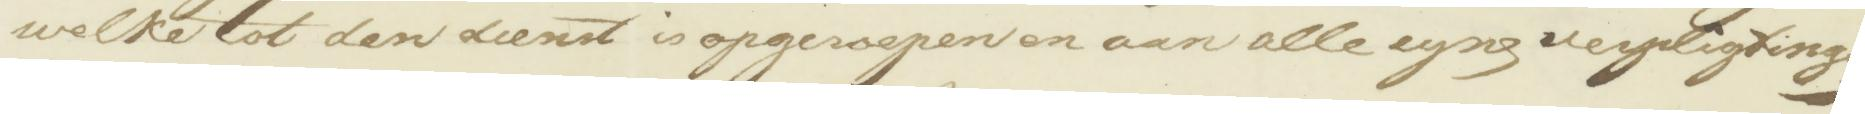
welke tot den dienst is opgeroepen en aan alle zyne verpligtingen
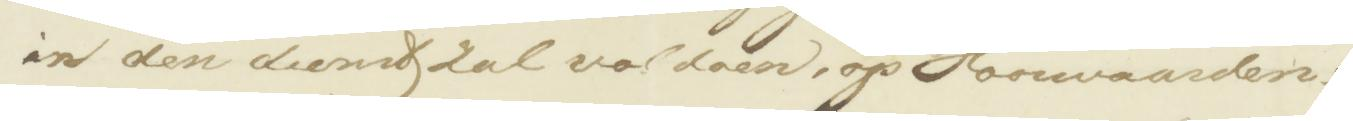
in den dienst zal voldoen, op voorwaarden:
